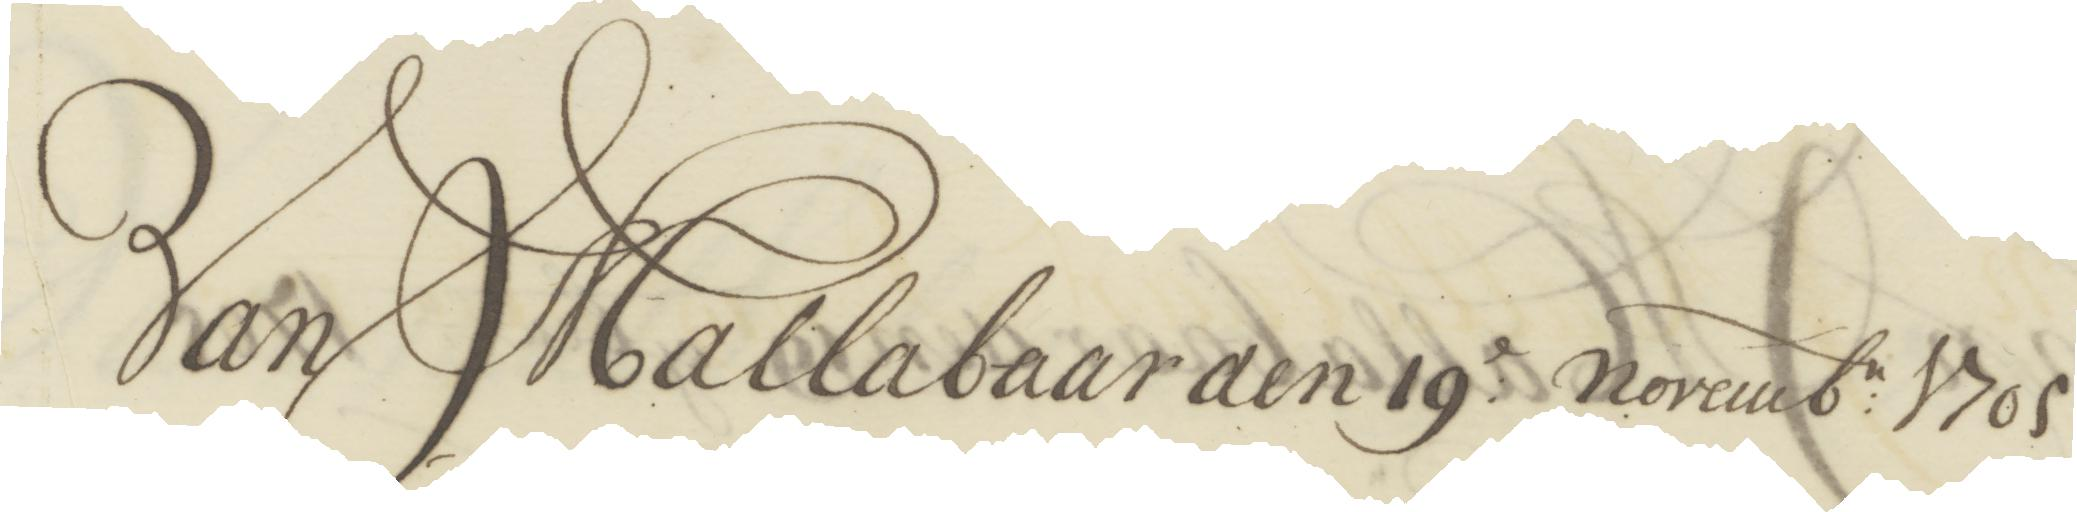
Van Mallabaar der 19:e Novemb:r 1705
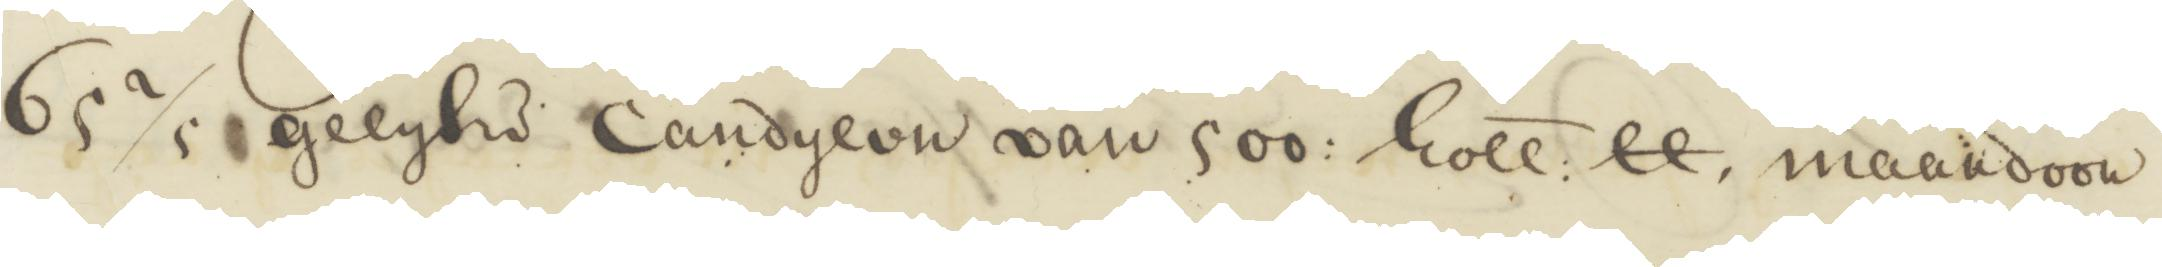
65 2/5 gelijke candijlen van 500: holl: lb, maar door
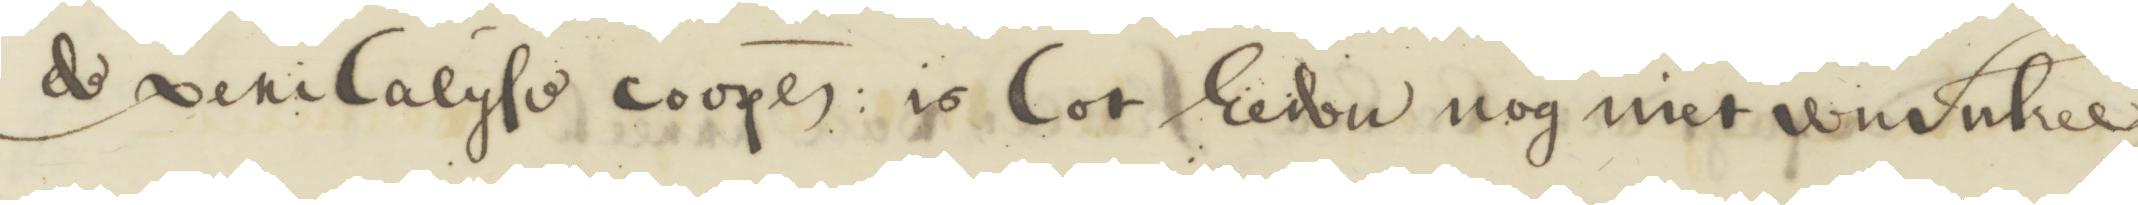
de peritalijse coopl: is tot heden nog niet een Enkel
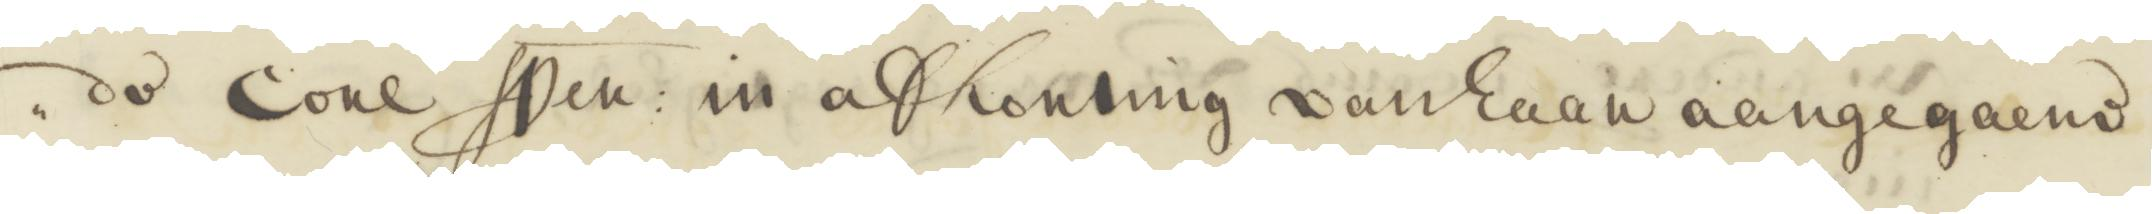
„de corl pper: in afkorting van haar aangegaene
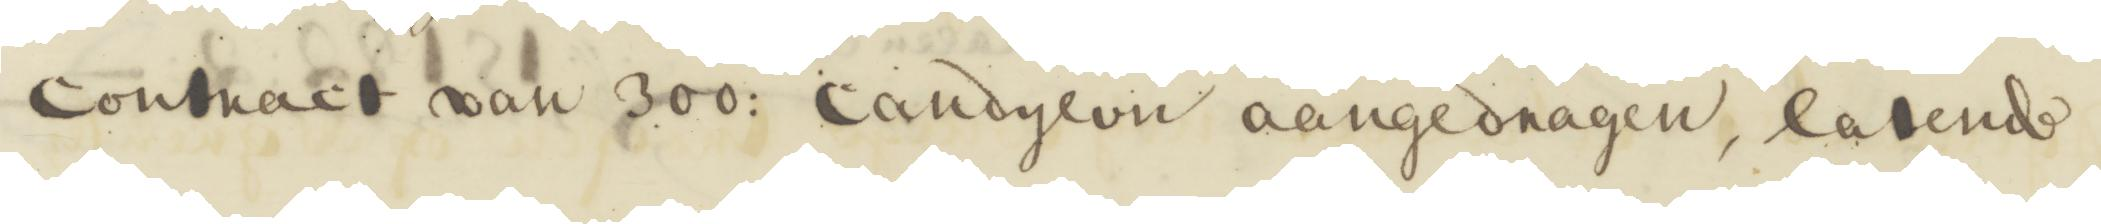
contract van 300: candijlen aangedragen, latende
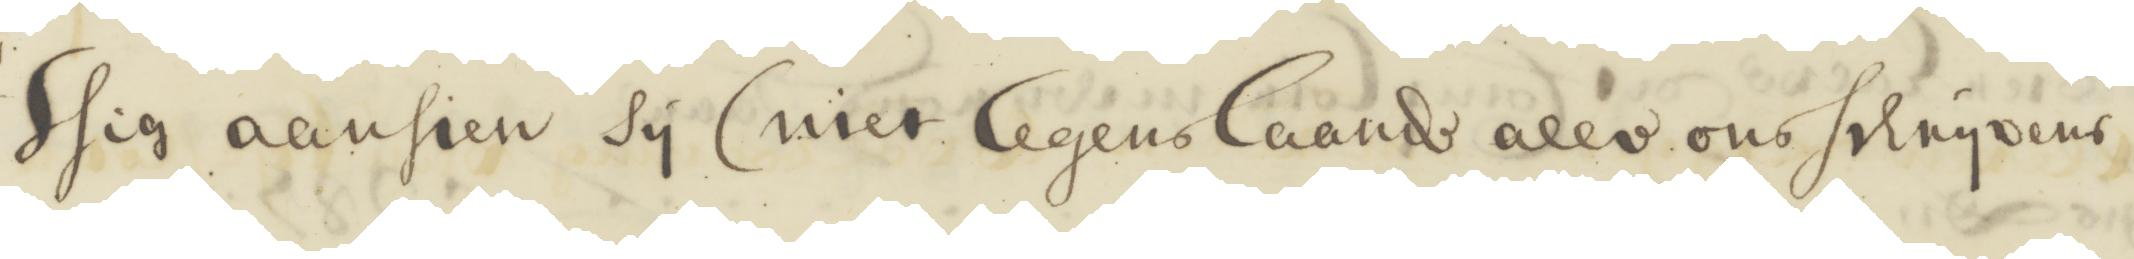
tsig aansien sij (niet tegenstaande alle ons schrijvens
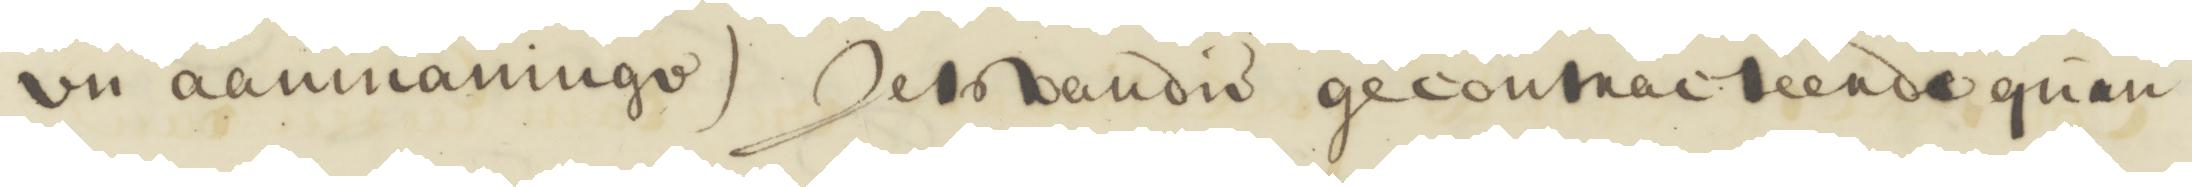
en aanmaninge) jets van die gecontracteerde quan
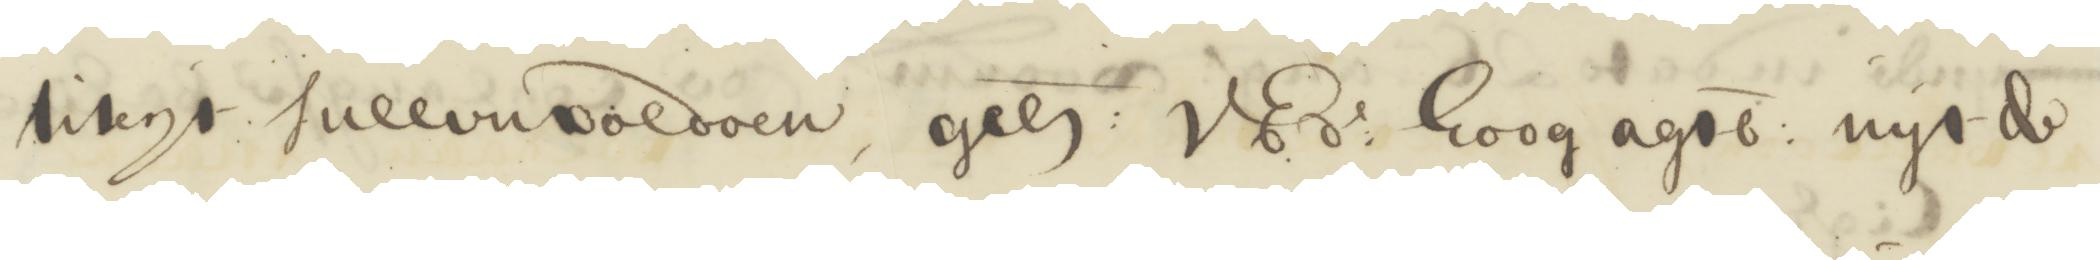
titeyt sullen voldoen, gelijk VEd:e hoog agtb: uijt de
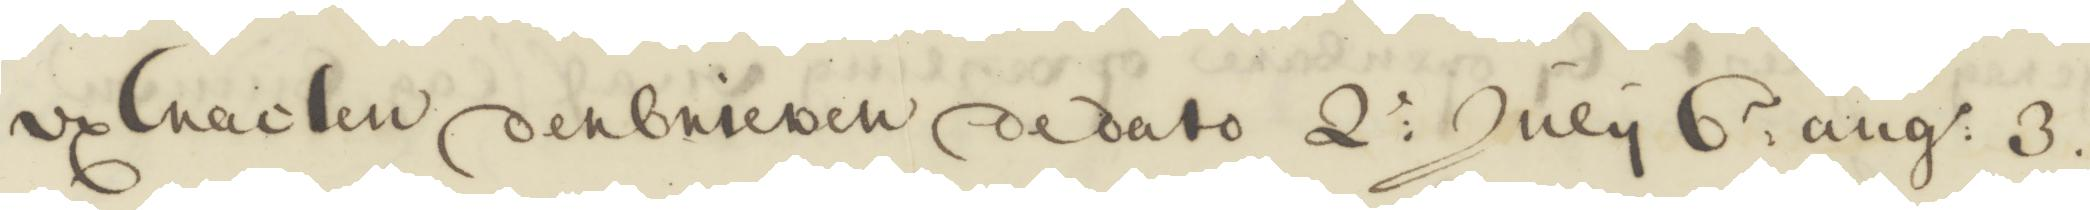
extracten derbrieven de dato 2:e Julij 6:' aug:o 3
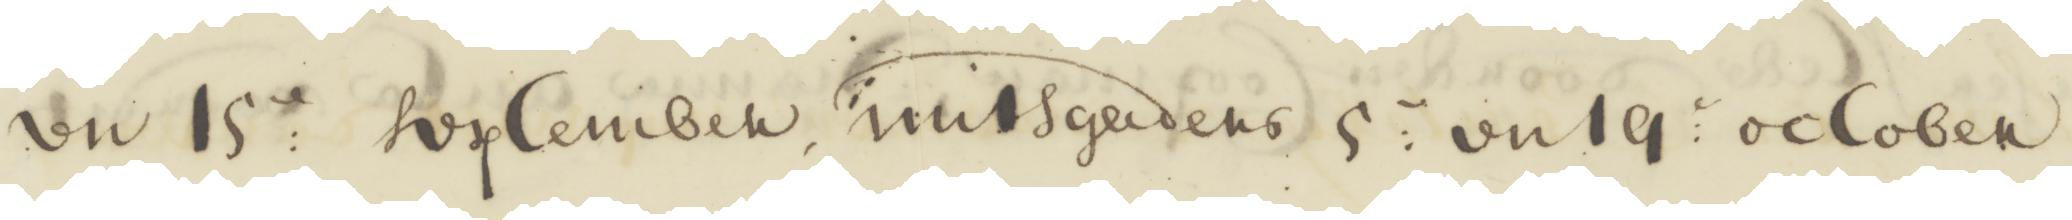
en 15:e september, mitsgaders 5:' en 14:' october
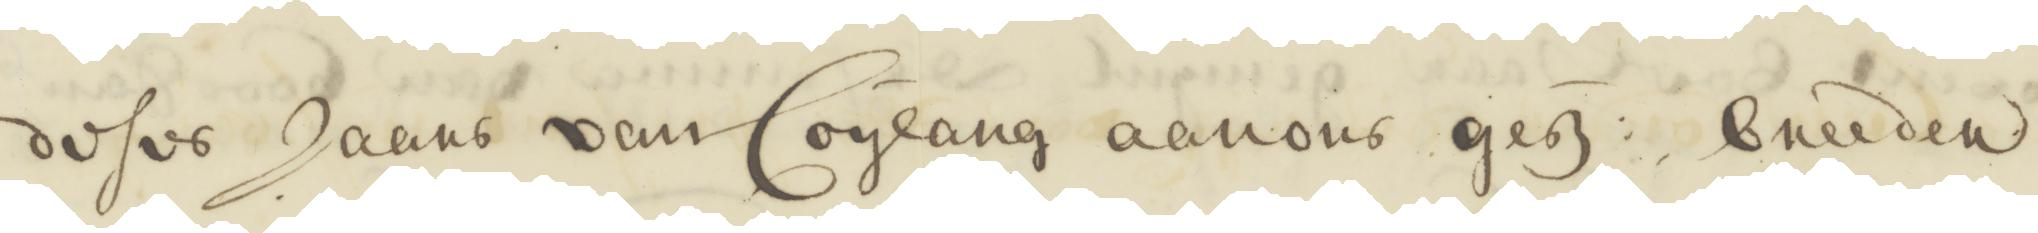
deses Jaars van Coijlang aan ons gesz:, breeder
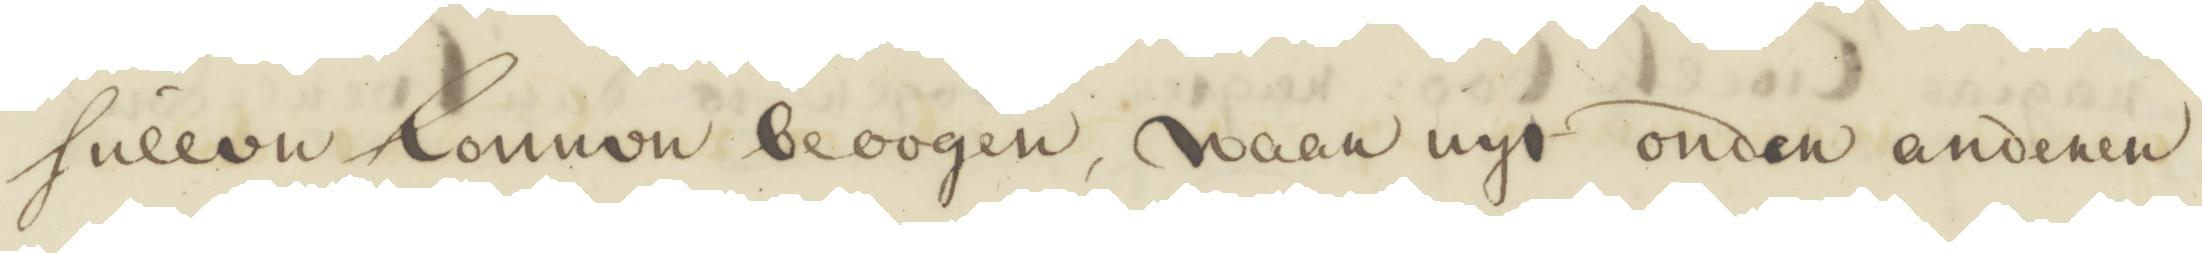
sullen konnen beoogen, waar uyt onder anderen
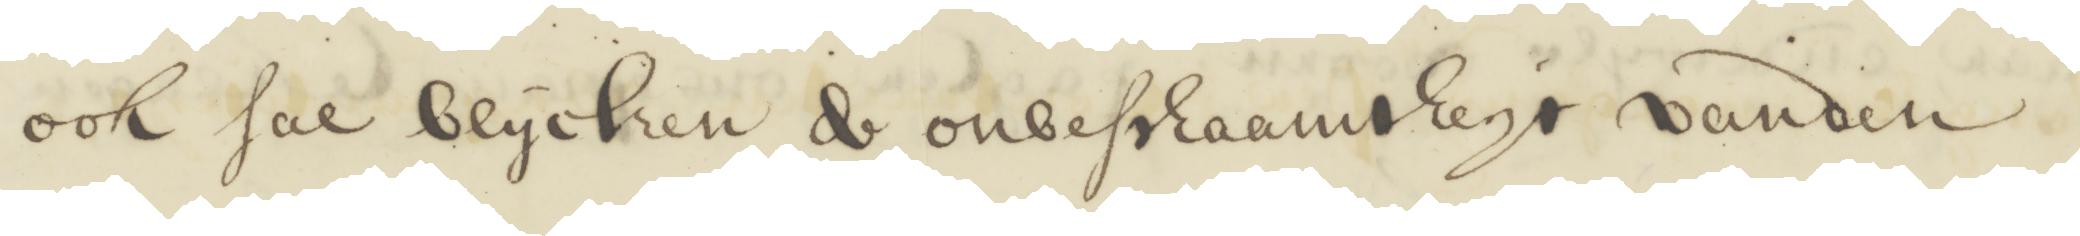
ook sal blijcken de onbeschaamtheijt vanden
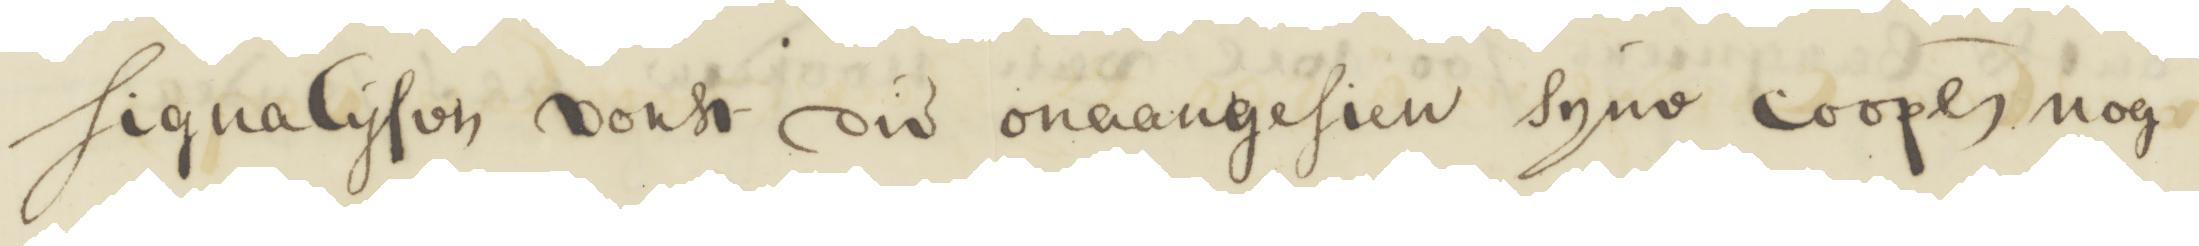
signalijsen vorst die onaangesien sijne coopl. nog
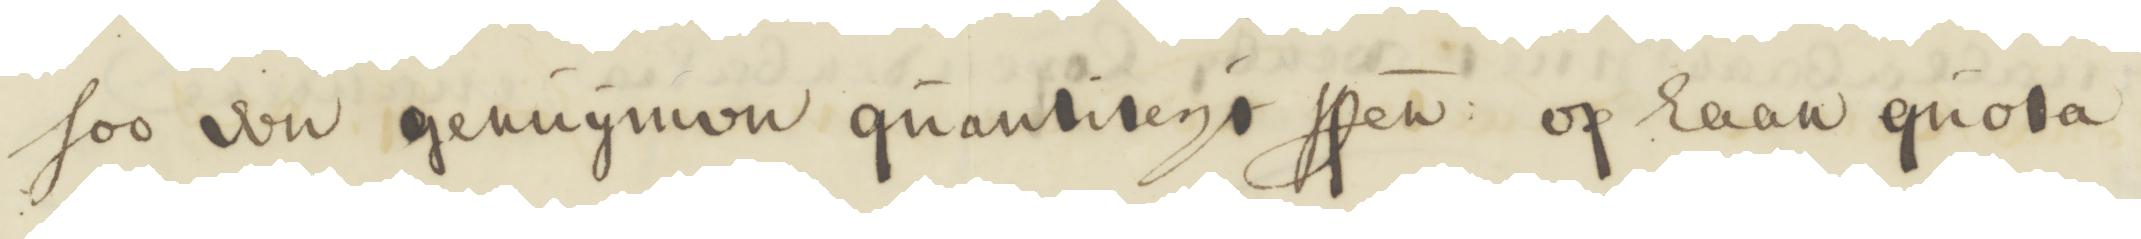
soo een geruijmen quantiteijt pper: op haar quota
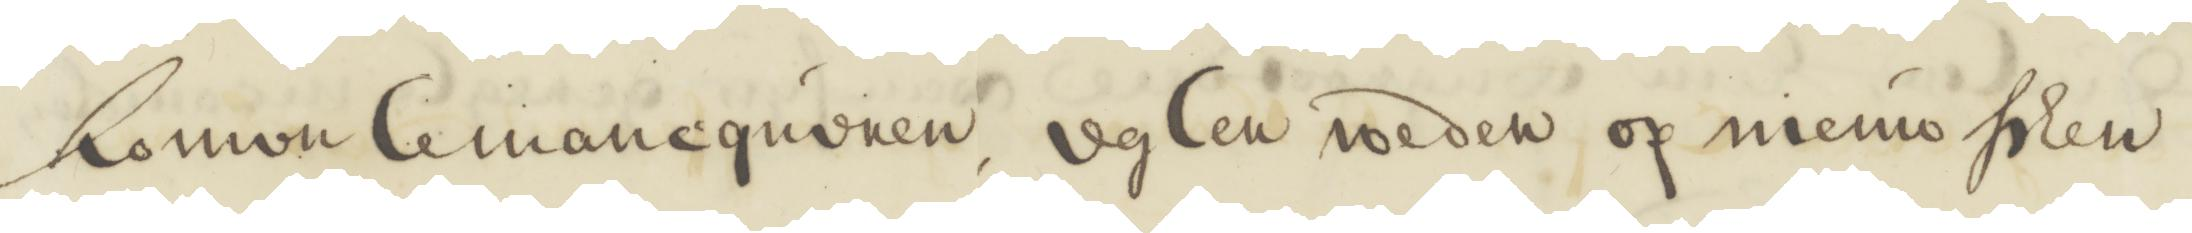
komen te mancqueren, egter weder op nieuw schen
